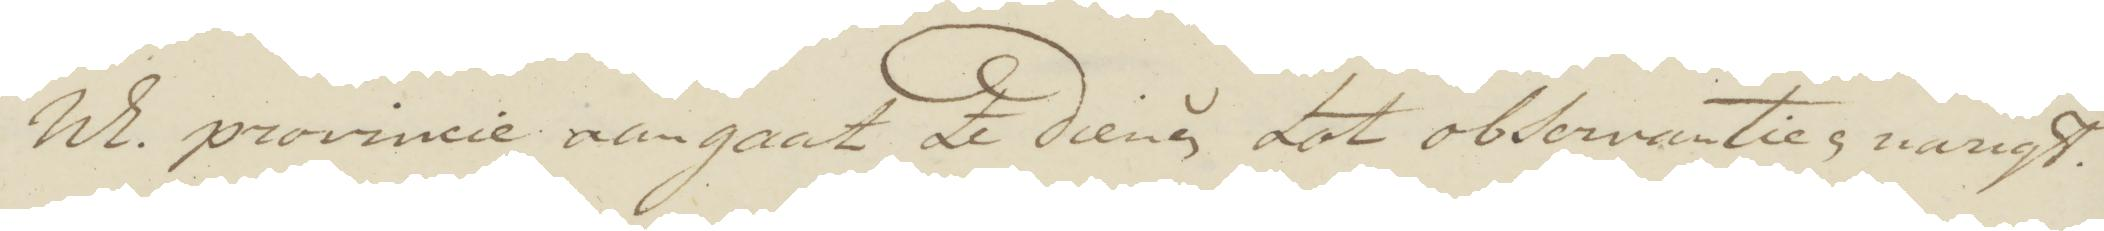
UE. provincie aan gaat te dienen tot observantie en narigt.
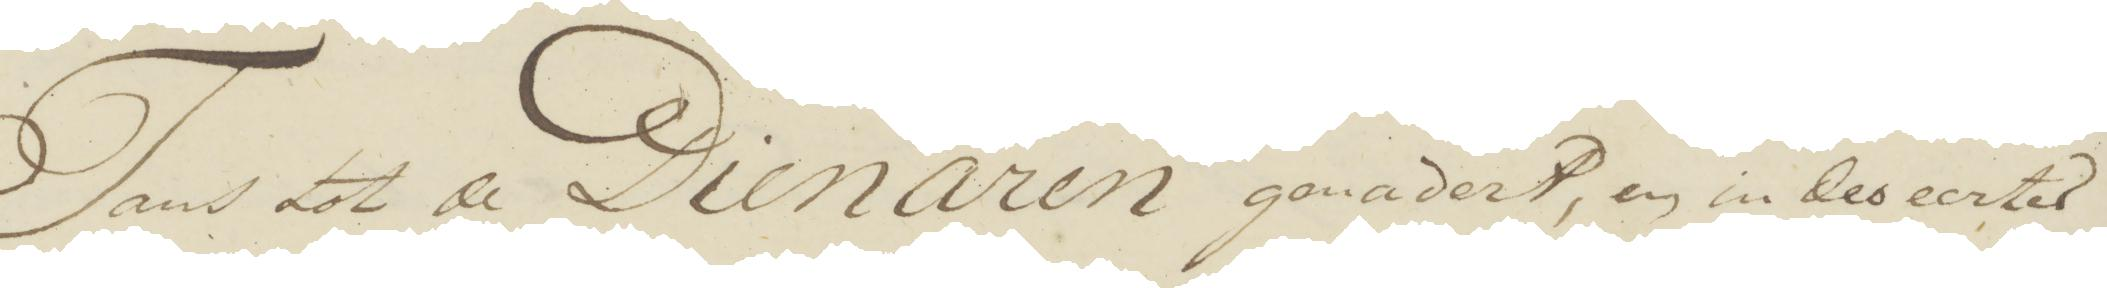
Tans tot de Dienaren genadert, en in des eertes
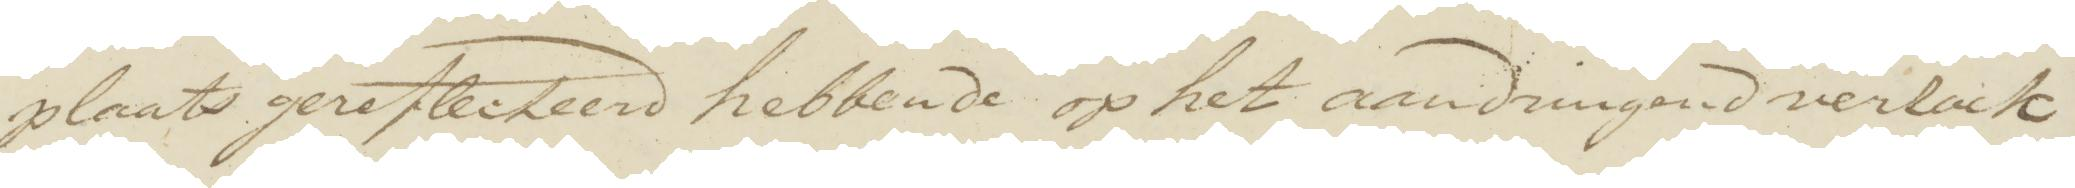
plaats gereflecteerd hebbende op het aandringend versoek
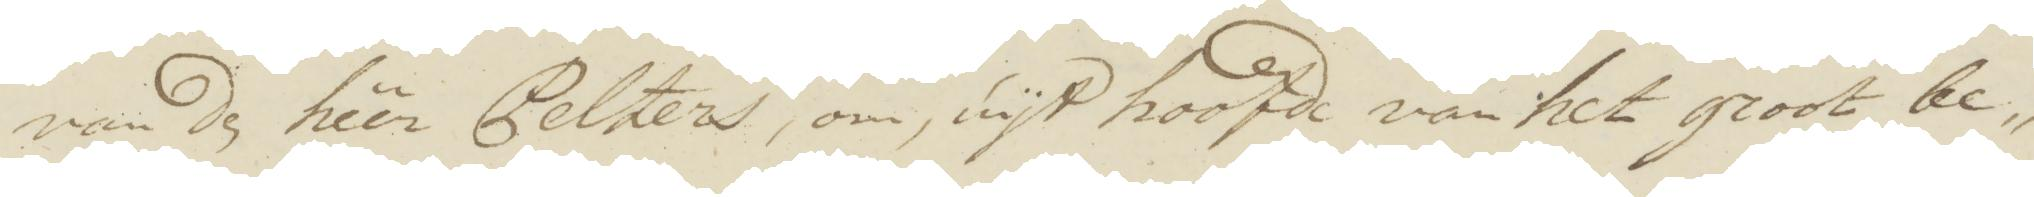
van den hier Pelters, om, uijt hoofde van het groot be„
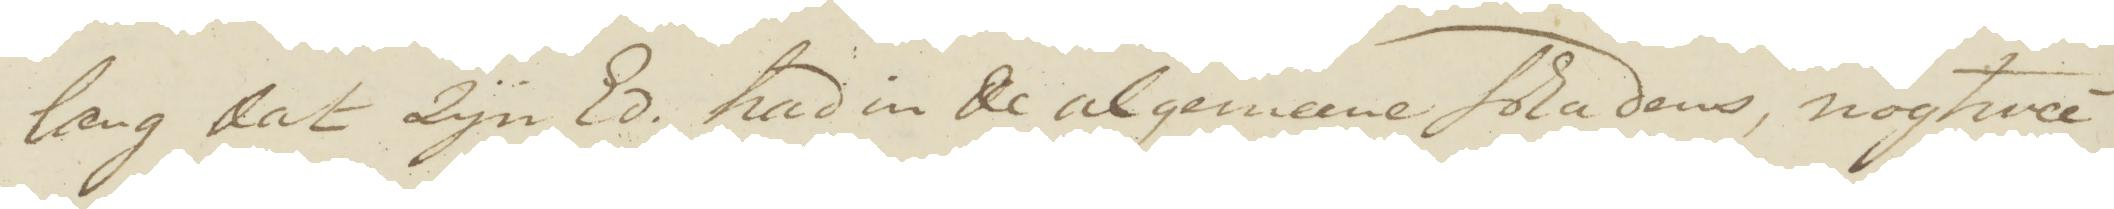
lang dat zijn Ed. had in de algemeene schadens, nog twee
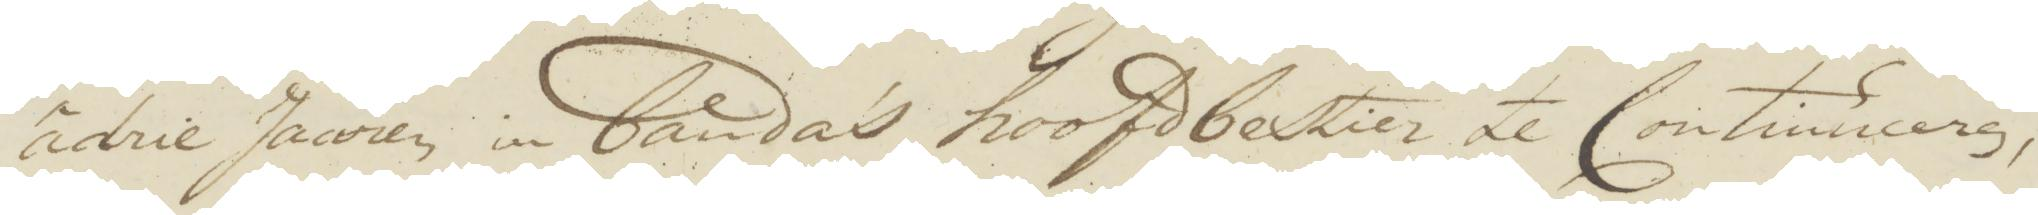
â drie jaaren in banda's hoofdbestier te Continueeren,
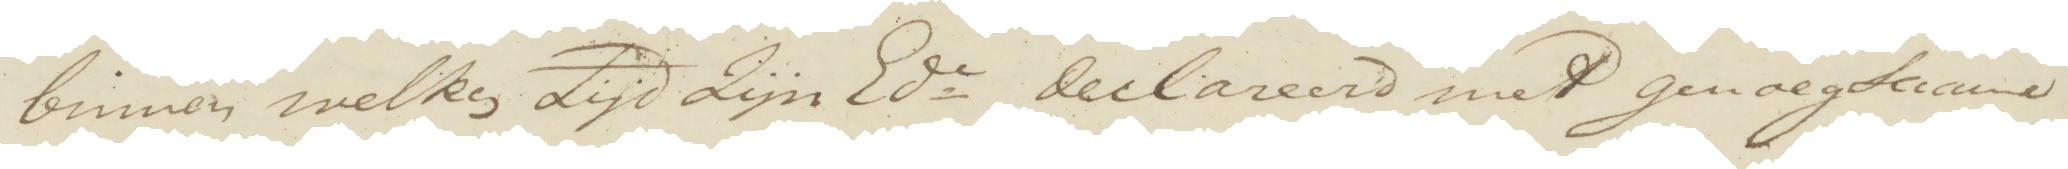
binnen welken tijd zijn Ed=e declareerd met genoegsaame
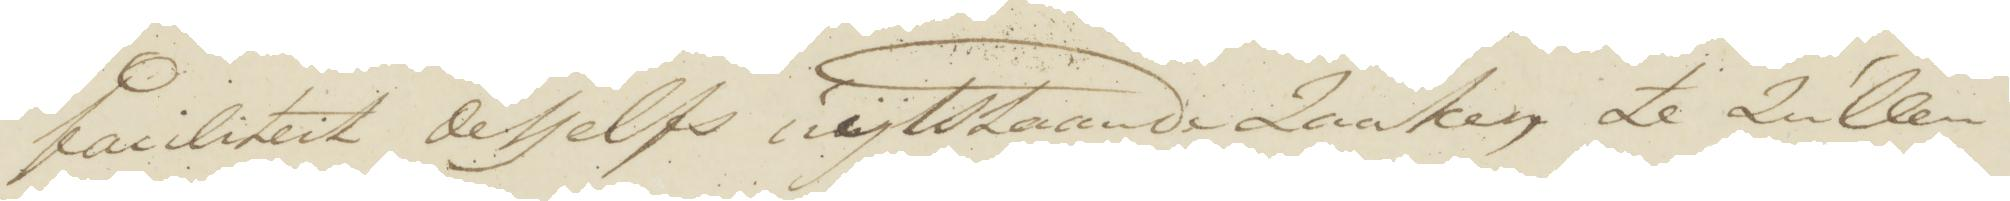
faciliteit desselfs uijtstaande zaaken te zullen
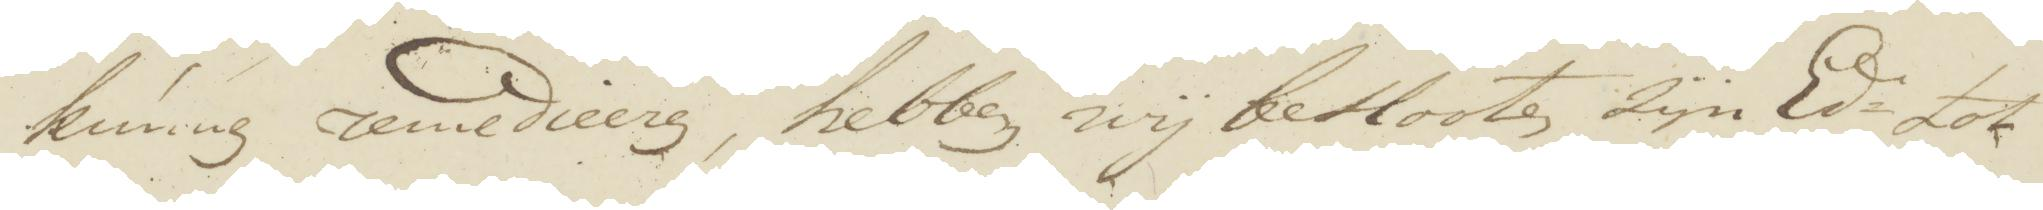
kunnen remedieeren, hebben wij beslooten zijn Ed=e tot
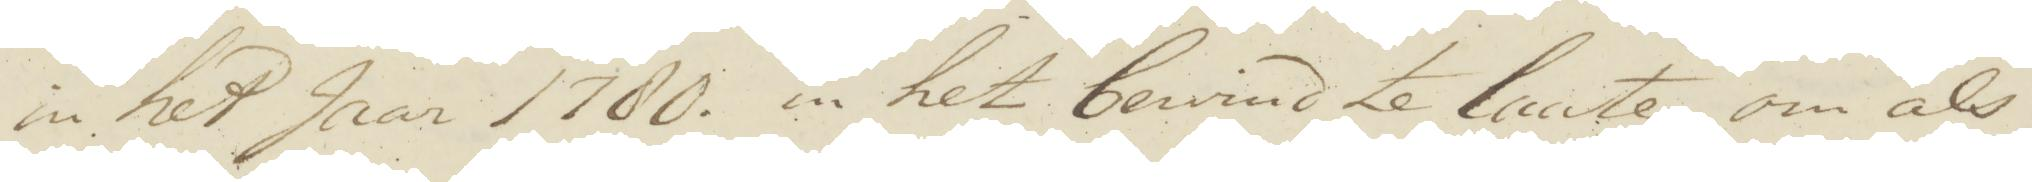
in het jaar 1780. in het bewind te laaten om als
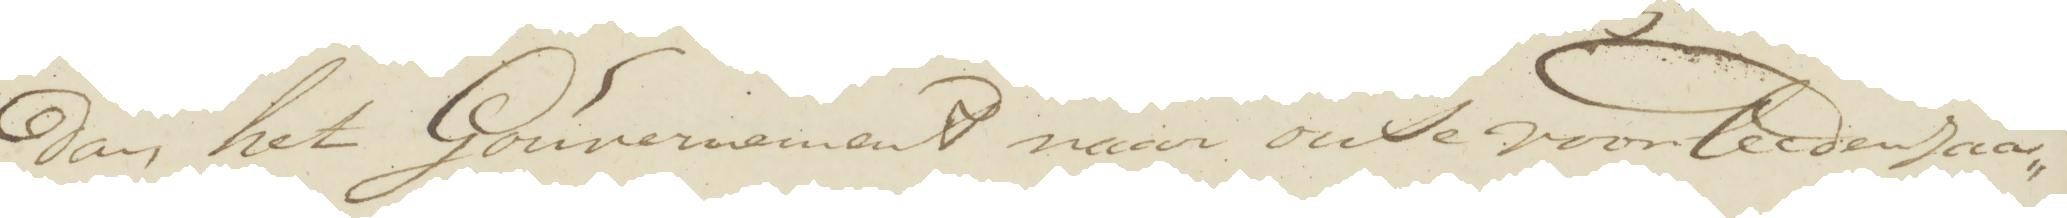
dan het Gouvernement naar onse voorleeden jaa„
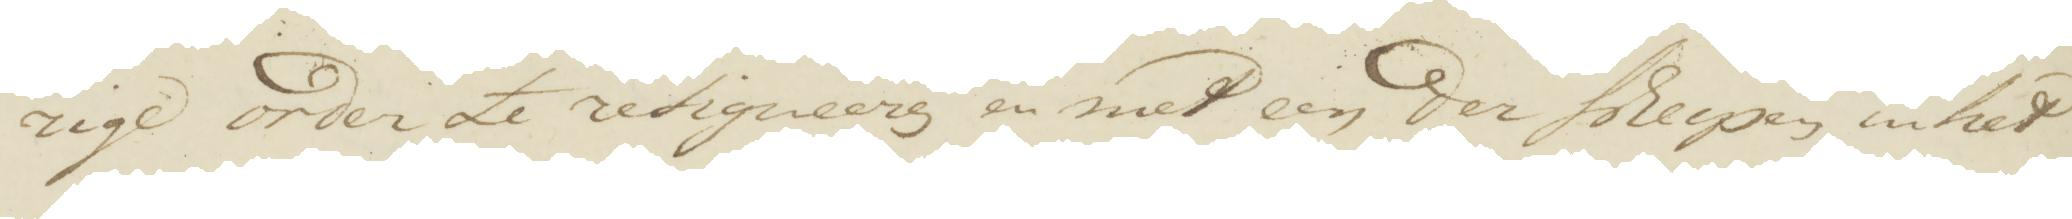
rige order te resigneeren en met een der scheepen in het
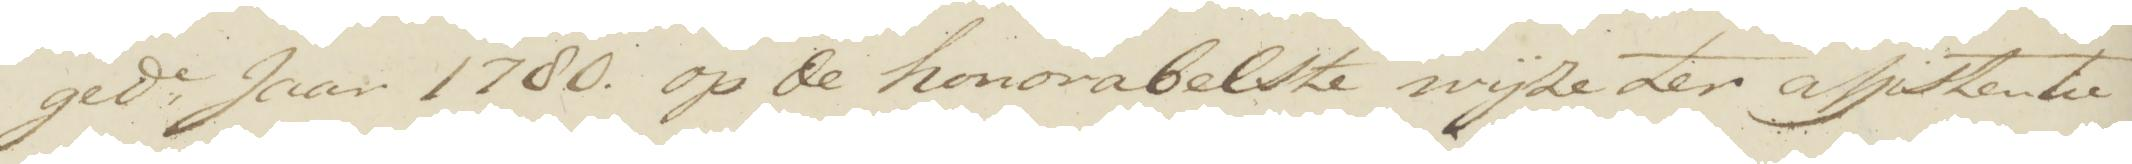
ged.e jaar 1780. op de honorabelste wijze ter assistentie
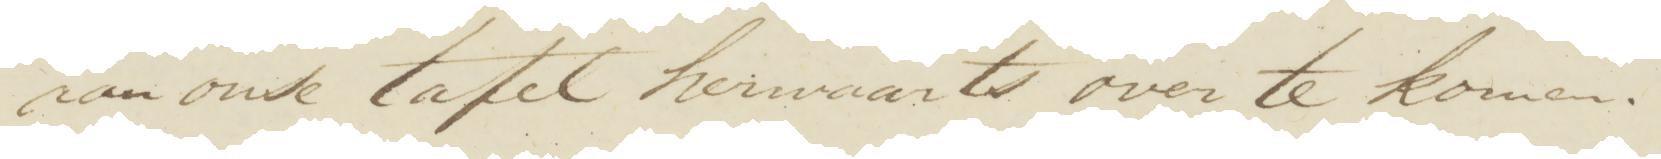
aan onse tafel herwaarts over te komen.
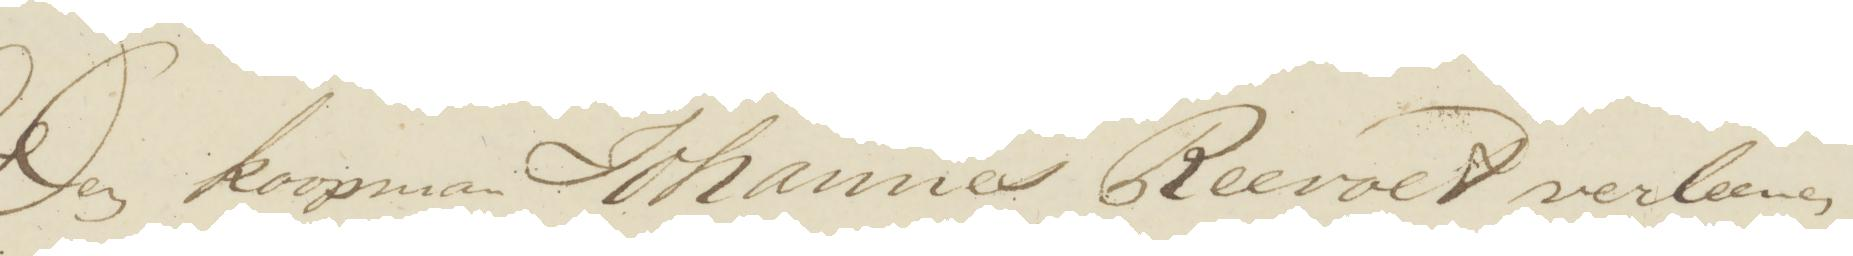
Den koopman Johannes Reevoet verleenen
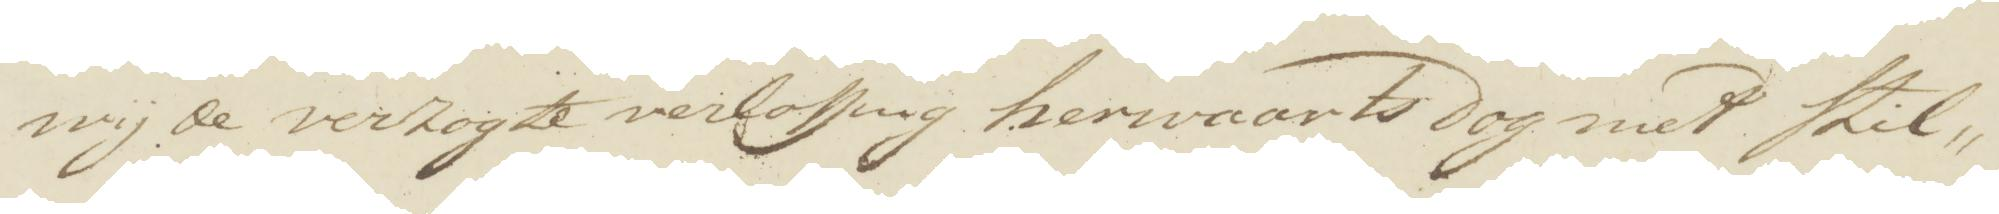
wij de verzogte verlossing herwaarts dog met stil„
